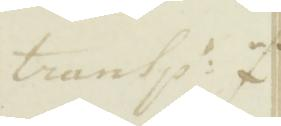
transp:t
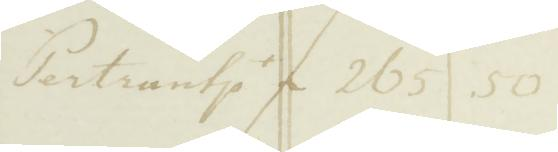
Per transp. ƒ 263 50
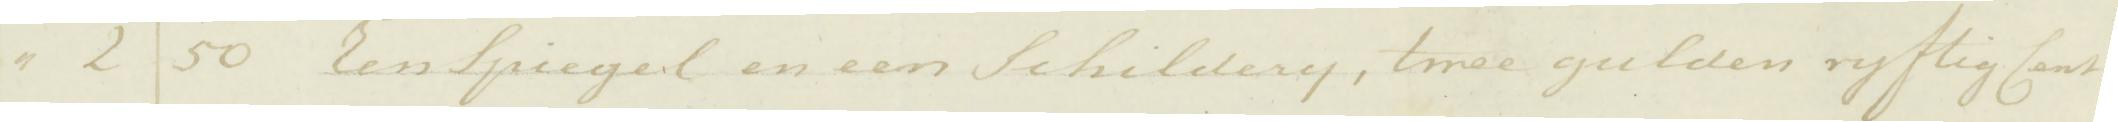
„ 2 50 Een spiegel en een schildery, twee gulden vyftig Cent
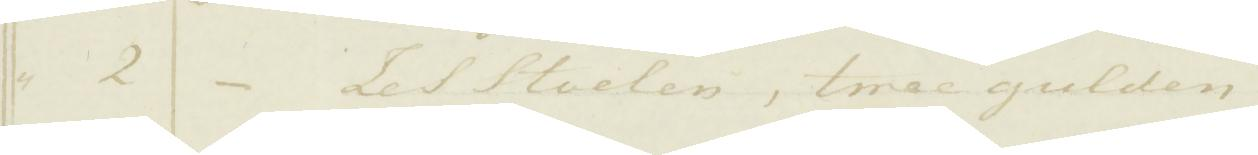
„ 2 — Zes stoelen, twee gulden
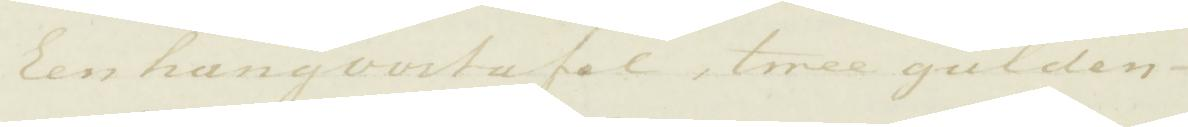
Een hangoortafel, twee gulden
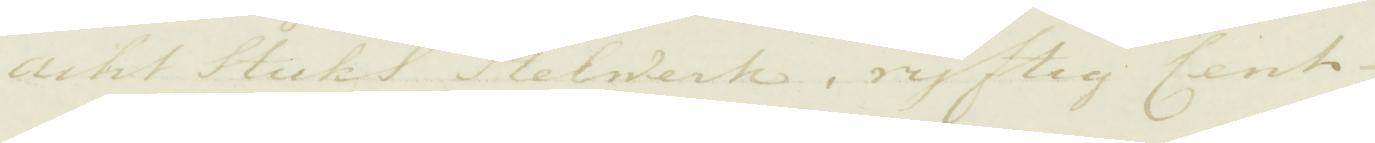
acht stuks stelwerk, vyftig Cents
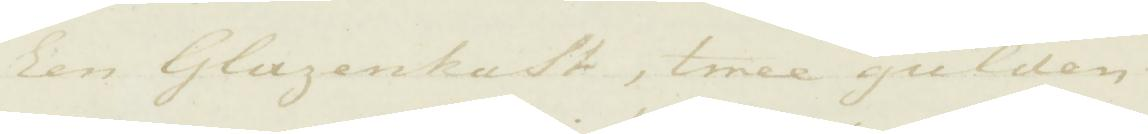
Een Glazenkast, twee gulden
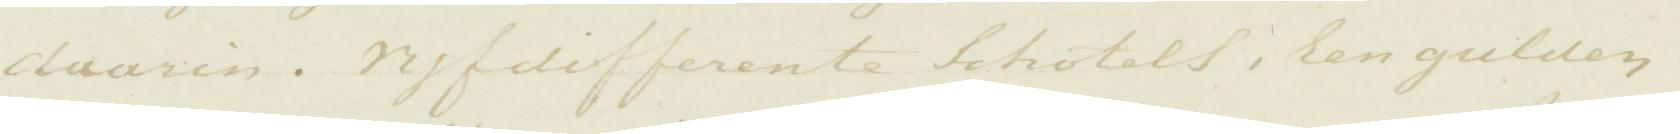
daarin. Vyf differente schotels, Een gulden
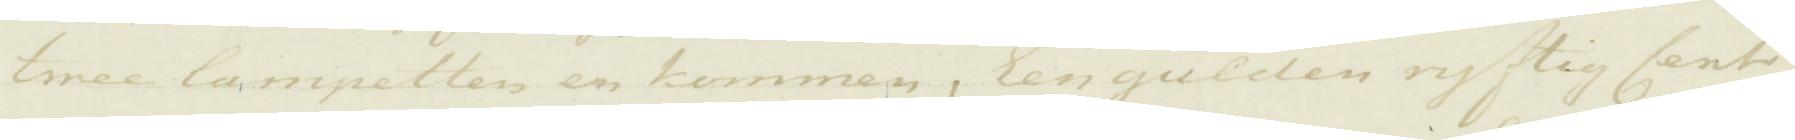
twee lampetten en kommen, Een gulden vyftig Cent
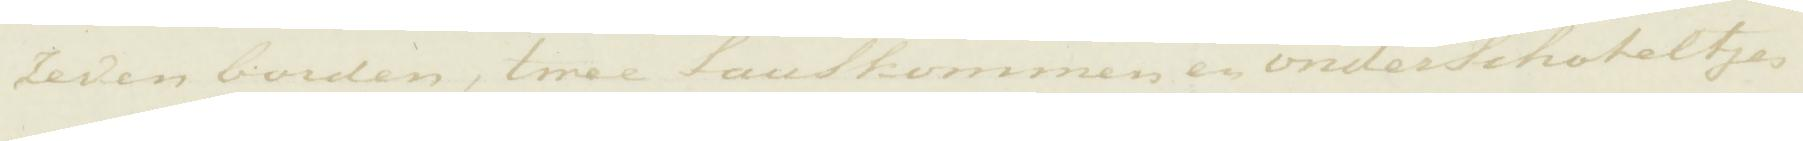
zeven borden, twee sauskommen en onderschoteltje
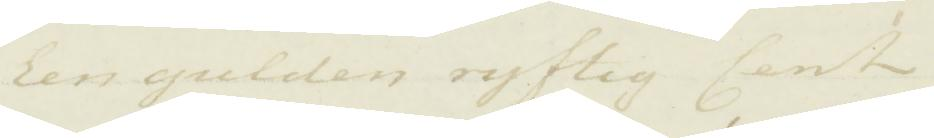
Een gulden vyftig Cent
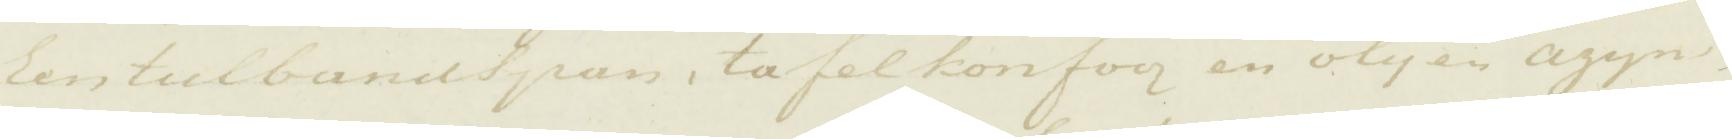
Een tulbandspan, tafelkonfoor en oly en azyn
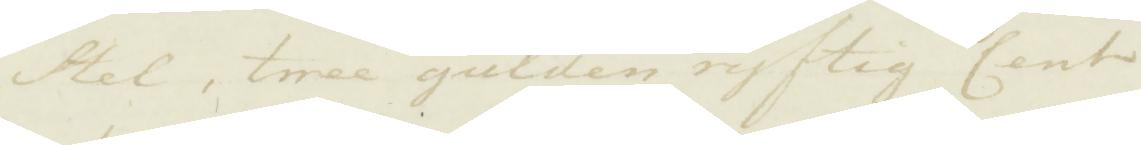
stel, twee gulden vyftig Cent
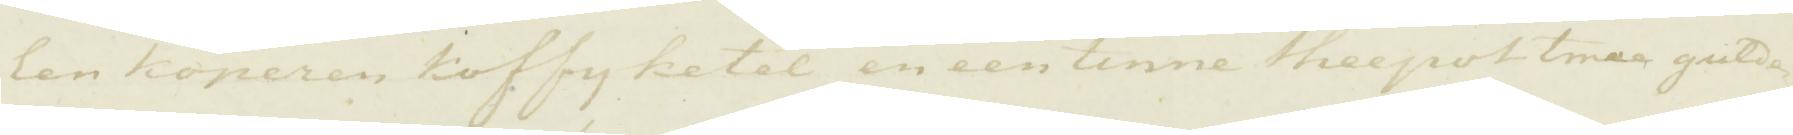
Een koperen koffyketel en een tinne theepot twee gulden
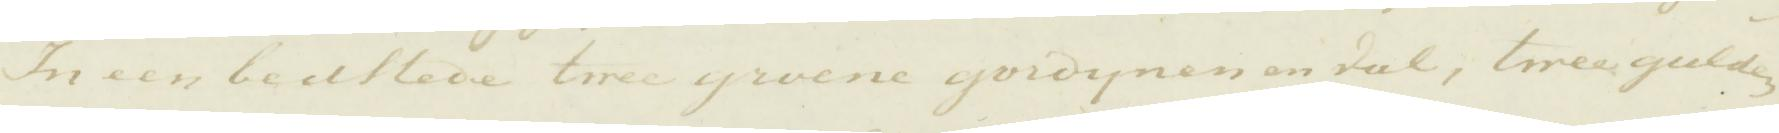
In een bedstede twee groene gordynen en vel; twee gulden
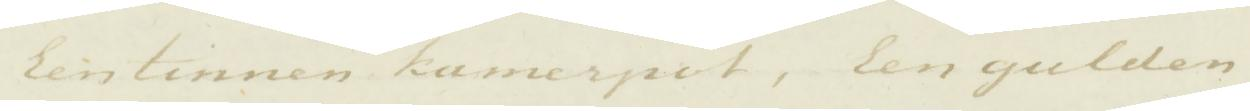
Een tinnen kamerpot, Een gulden
